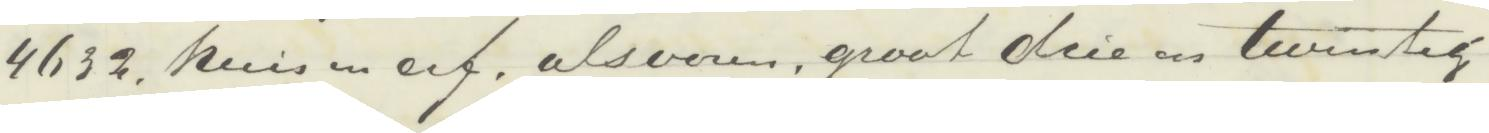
4632, huis en erf, alsvoren, groot drie en twintig
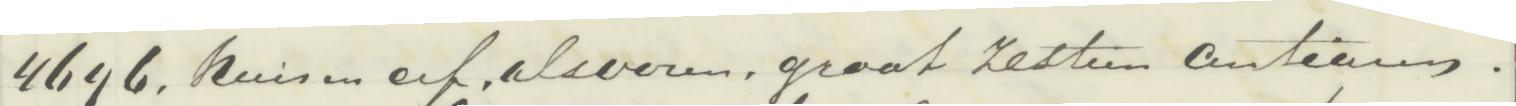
4696, huis en erf, alsvoren, groot zestien centiaren.
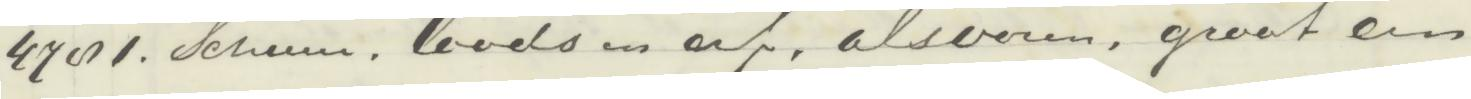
4781. schuur, loods en erf, alsvoren, groot een
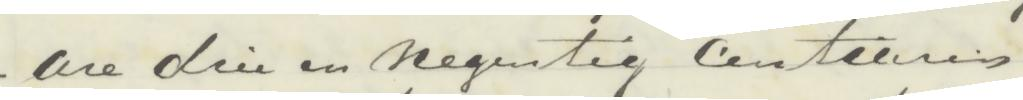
are drie en negentig centiaren
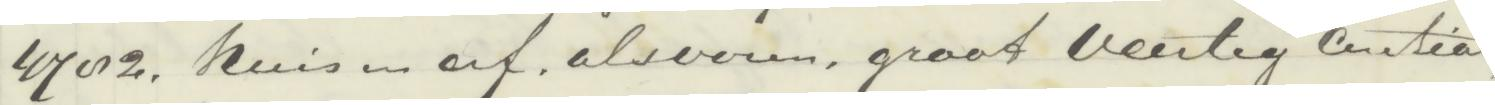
4782, huis en erf, alsvoren, groot veertig centia
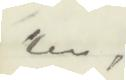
ren„
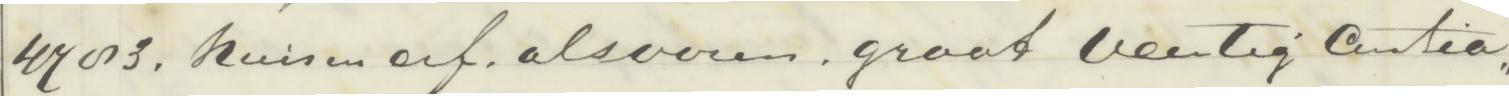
4783, huis en erf, alsvoren, groot veertig centia„
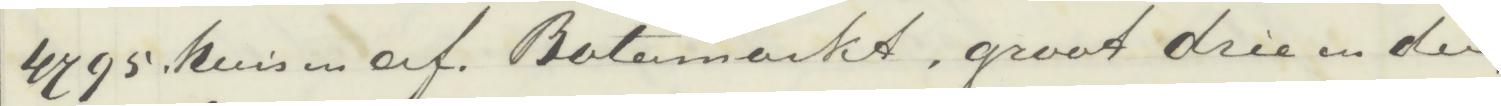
4795. huis en erf. Botermarkt, groot drie en der
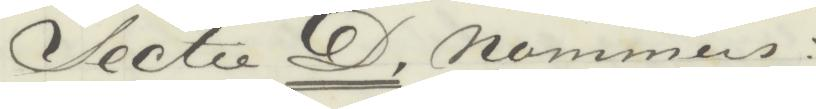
Sectie D, Nommers :
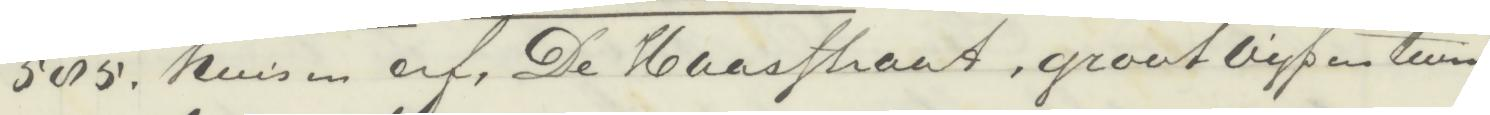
585, huis en erf, De Haasstraat, groot vijf en twin
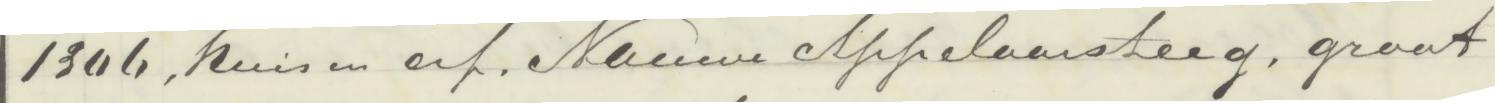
1306, huis en erf, Nauwe Appelaarsteeg, groot
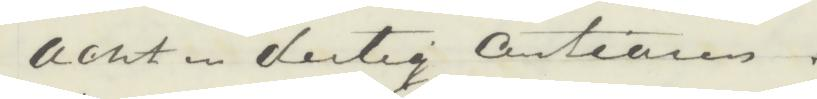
acht en dertig centiaren
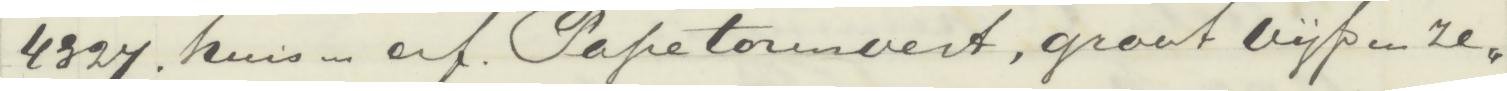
4327, huis en erf. Papetorenvest, groot vijf en ze„
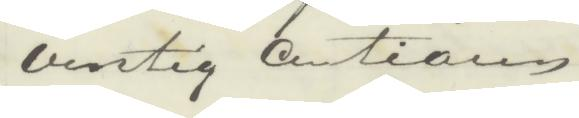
ventig centiaren
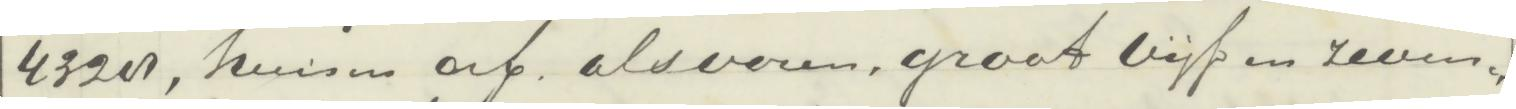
4328, huis en erf, alsvoren, groot vijf en zeven„
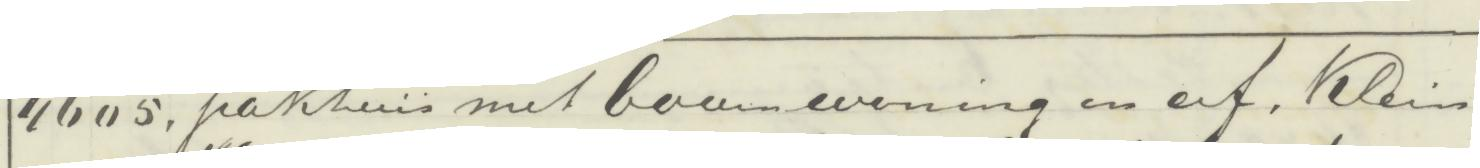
4605, pakhuis met bovenwoning en erf, Klein
